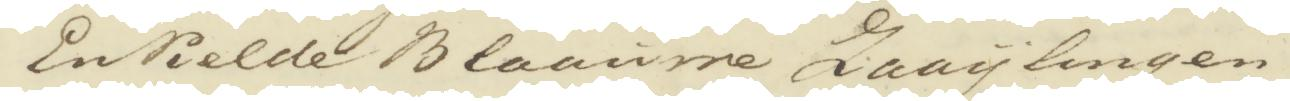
Enkelde Blaauwe Zaaijlingen
